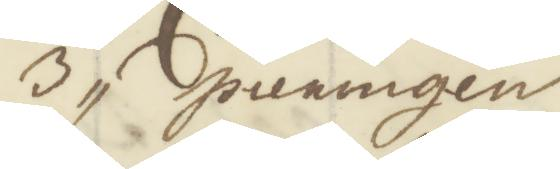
3„ pieringen
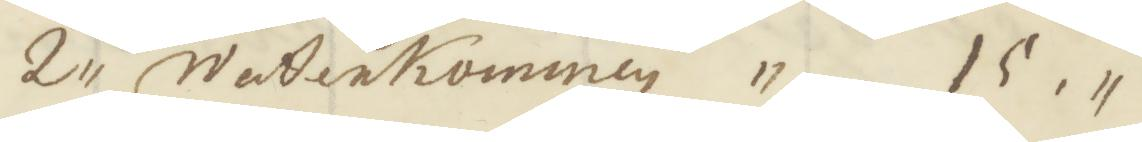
2„ waterkommen „ 15 , „
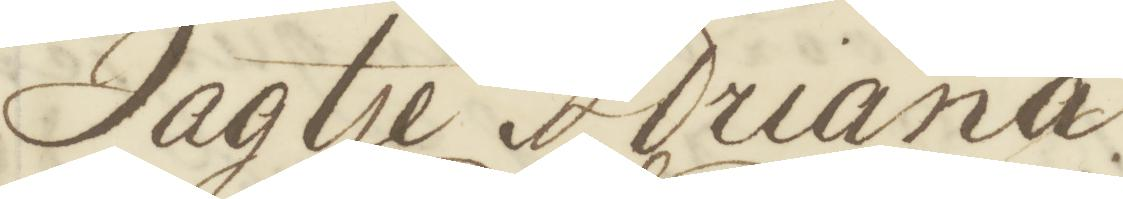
'T Iagtje Adriana
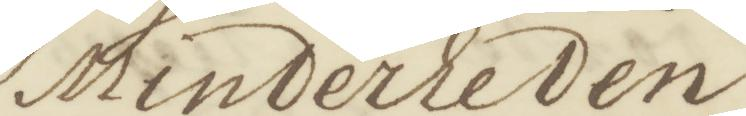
Minderheden
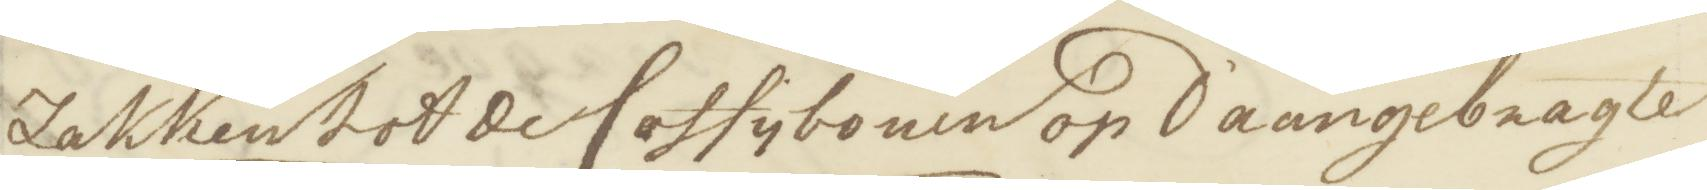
zakken tot de Coffijbonen op d’aangebragte
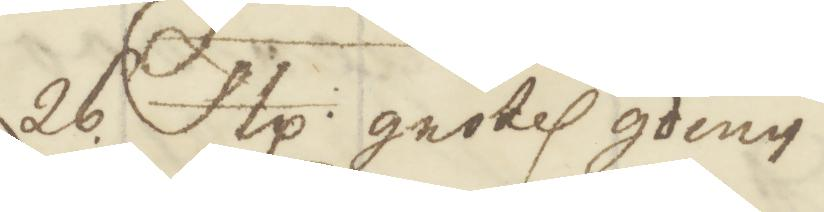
26. Stx: grote goenij
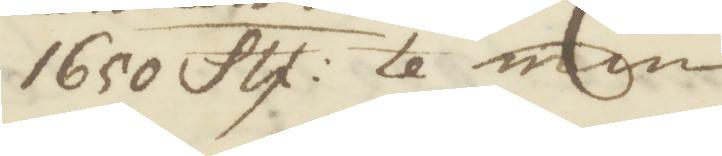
1650 stx: te min
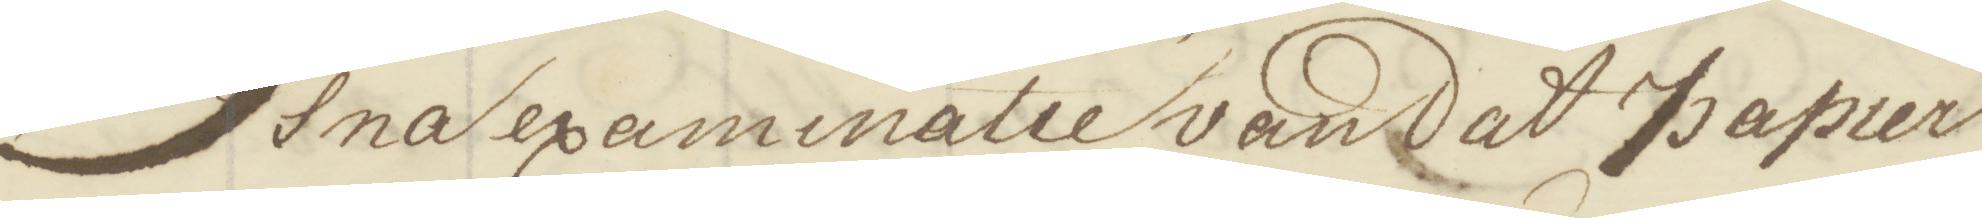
Is na examinatie van dat papier
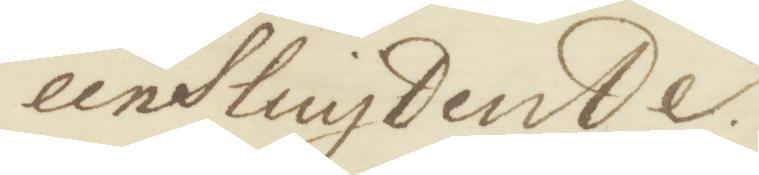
eens luijdende.
